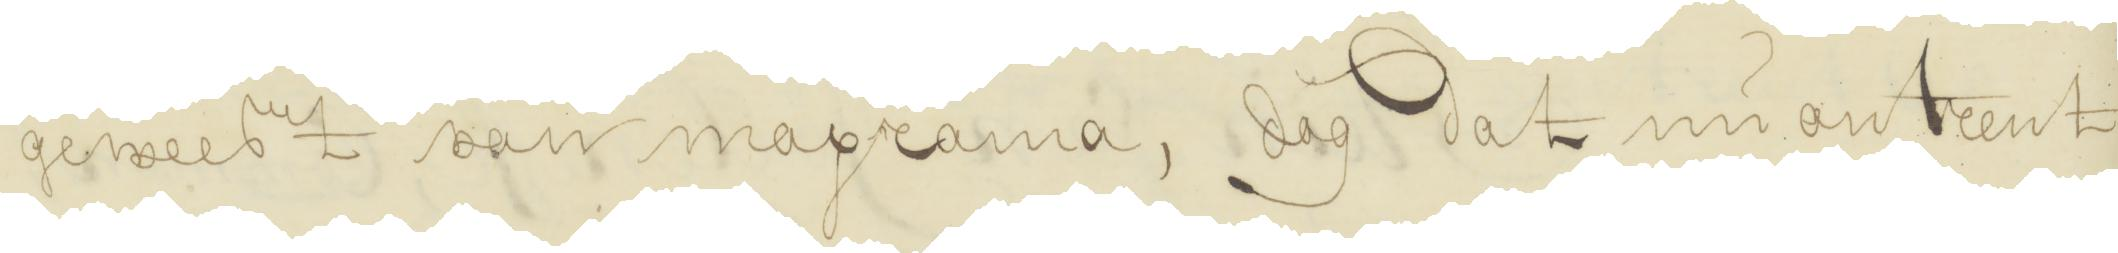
geweest van maprama, dog dat nu ontrent
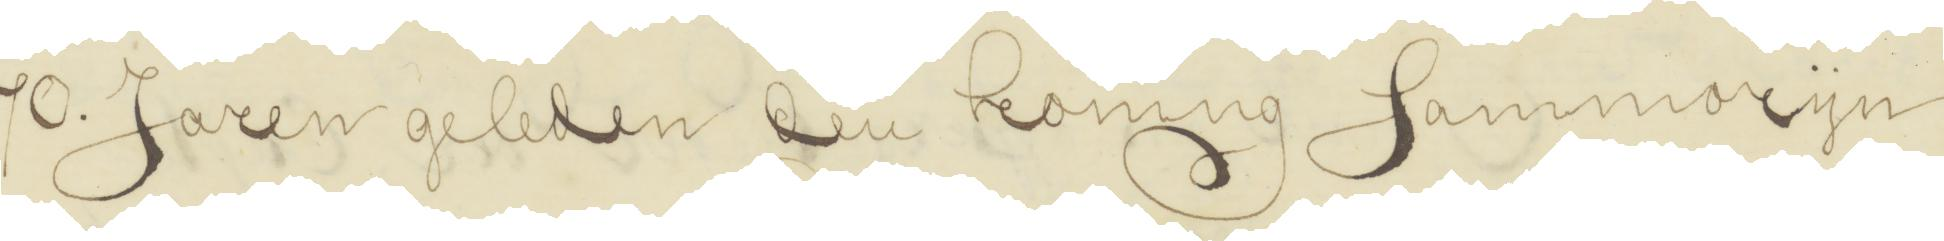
70. Jaren geleden den koning sammorijn
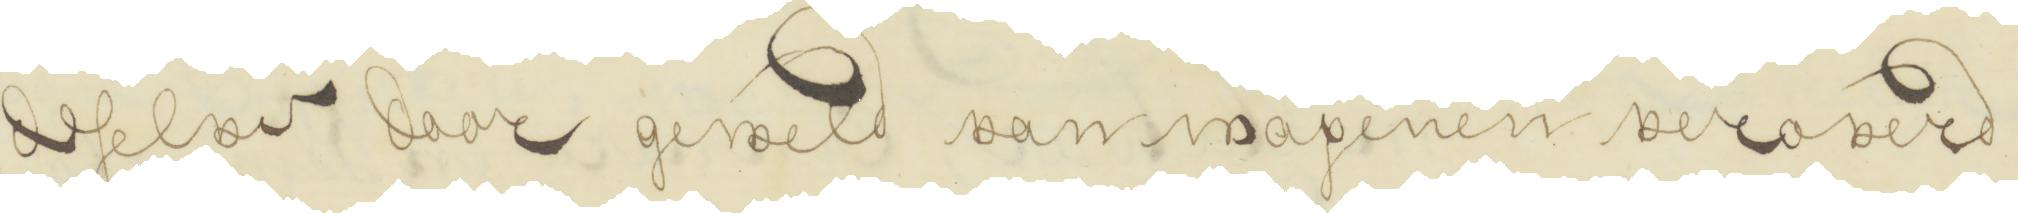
deselve door geweld van wapenen veroverd
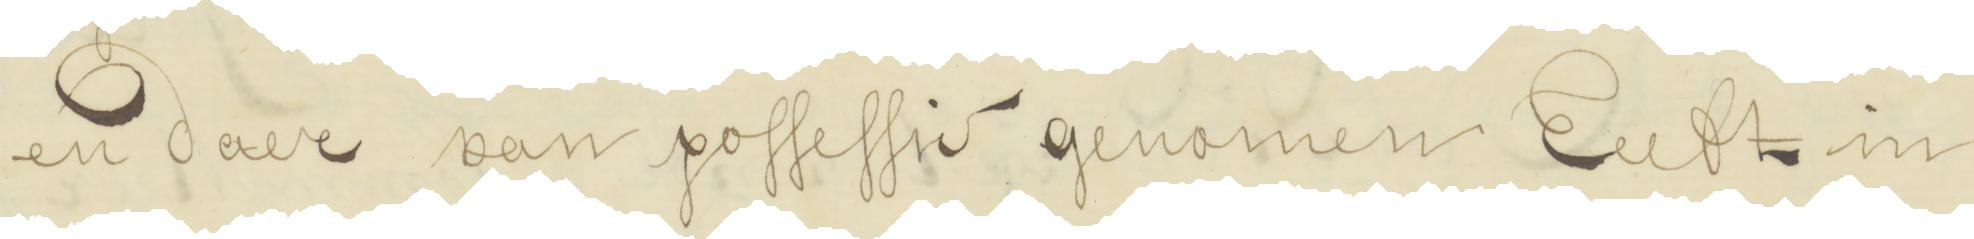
en daer van possessie genomen heeft in
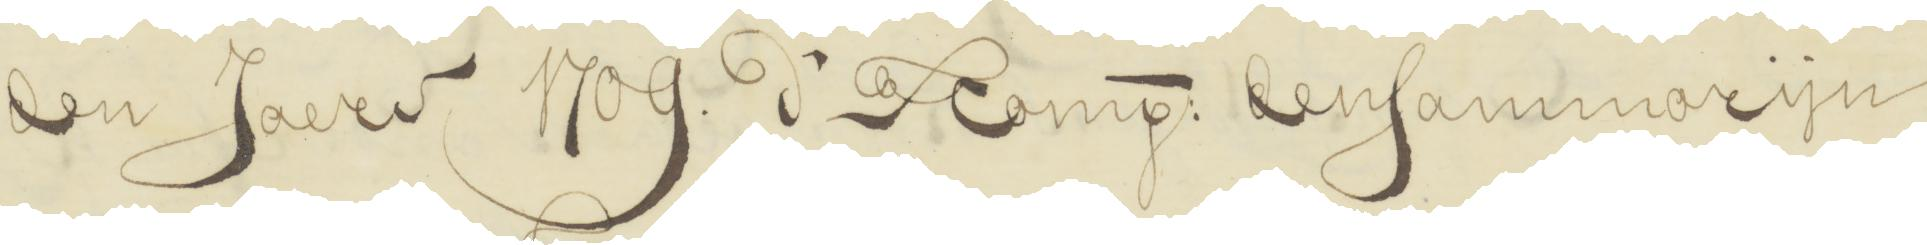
den Jaere 1709. d’ E Comp: den sammorijn
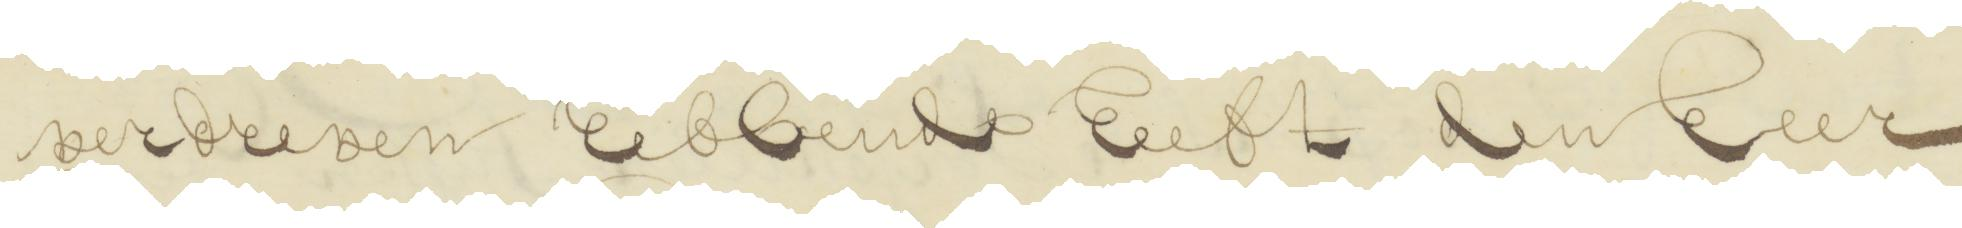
verdreven hebbende heeft den heer
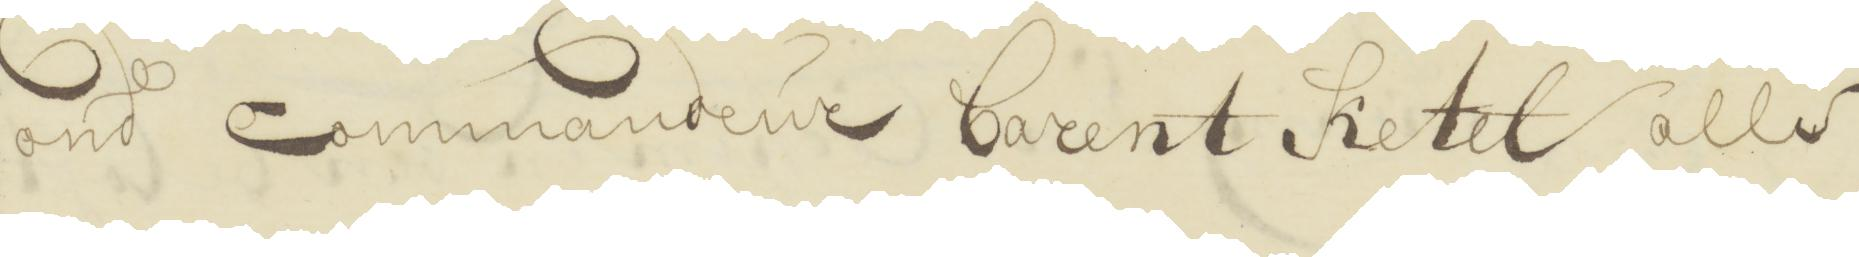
oud Commandeur barent ketel alle
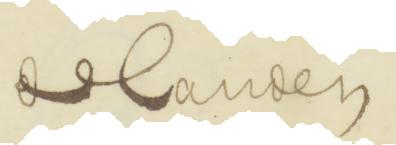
de landen
